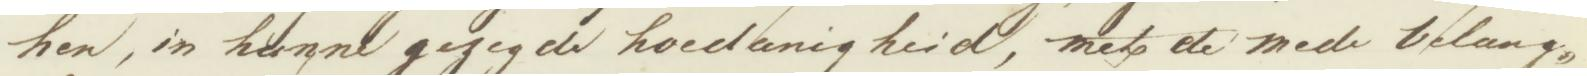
hen, in hunne gezegde hoedanigheid, met de mede belang„
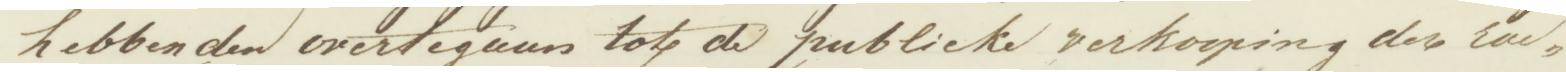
hebben den overtegaan tot de publieke verkooping der roe„
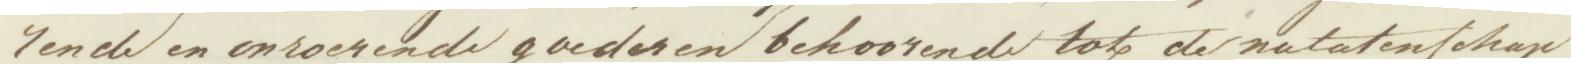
rende en onroerende goederen behoorende tot de nalatenschap
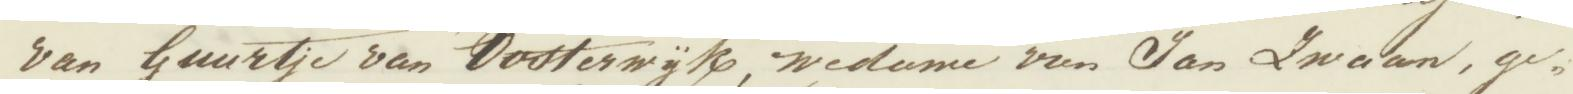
van Guurtje van Oosterwijk, weduwe van Ian Zwaan, ge„
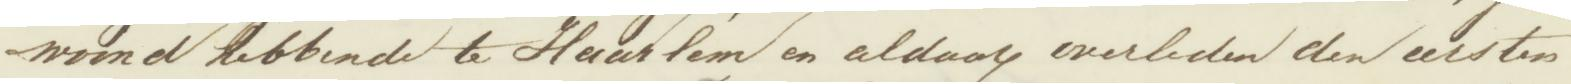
woond hebbende te Haarlem en aldaar overleden den eersten
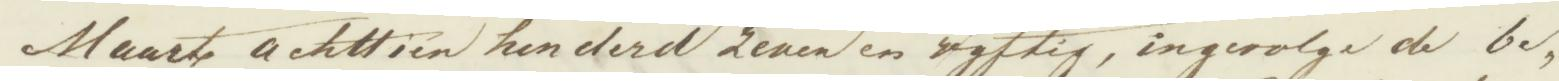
Maart achttien honderd zeven en vyftig, ingevolge de be
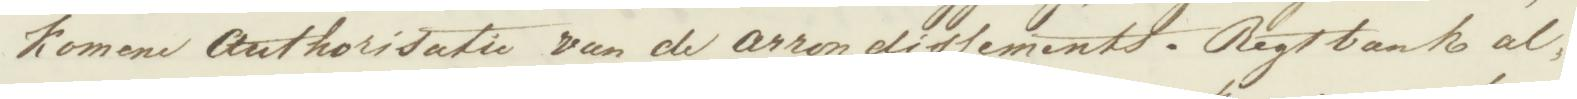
komene Authorisatie van de arrondissements- Regtbank al,
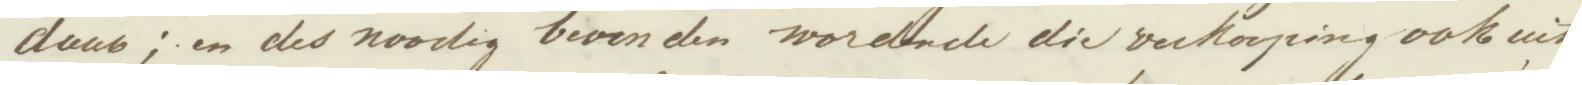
daar; en des noodig bevon den wordende die verkooping ook uit
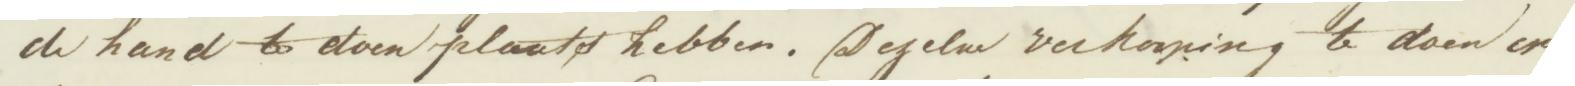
de hand te doen plaats hebben. Dezelve verkooping te doen en
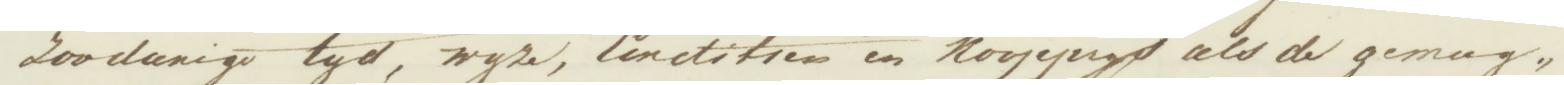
zoodanige tyd, wyze, Conditien en koopprys als de gemag„
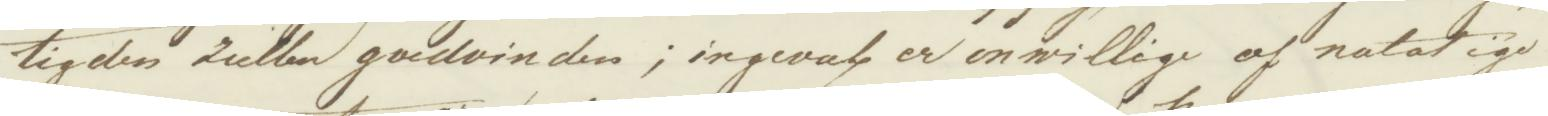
tig den zullen goedvinden; ingeval er onwillige of nalatige
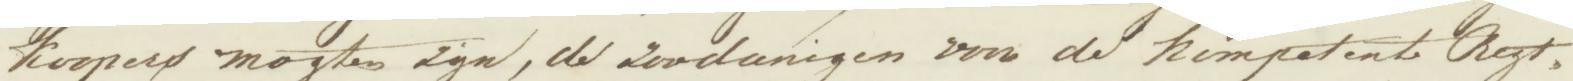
Koopers mogten zijn, de zoodanigen voor de kompetente Regt
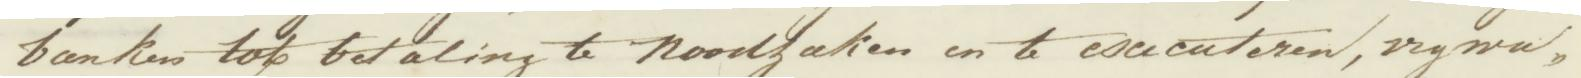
banken tot betaling te noodzaken en te executeren, vrij wa„
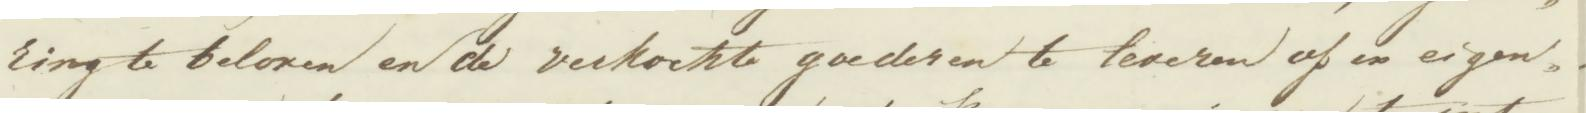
ring te beloven en de verkochte goederen te leveren of in eigen„
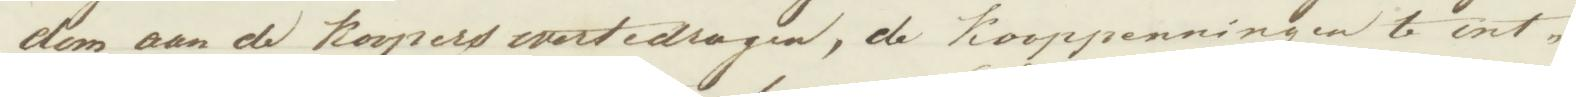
dom aan de Koopers overtedragen, de Kooppenningen te ont„
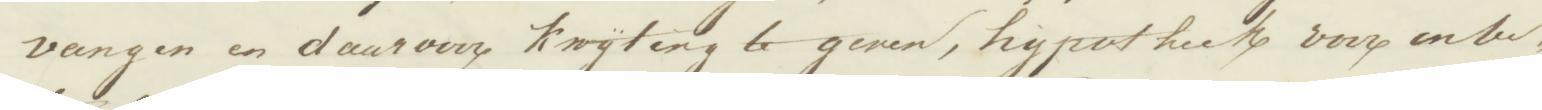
vangen en daar voor kwijting te geven, hijpotheek voor en be
